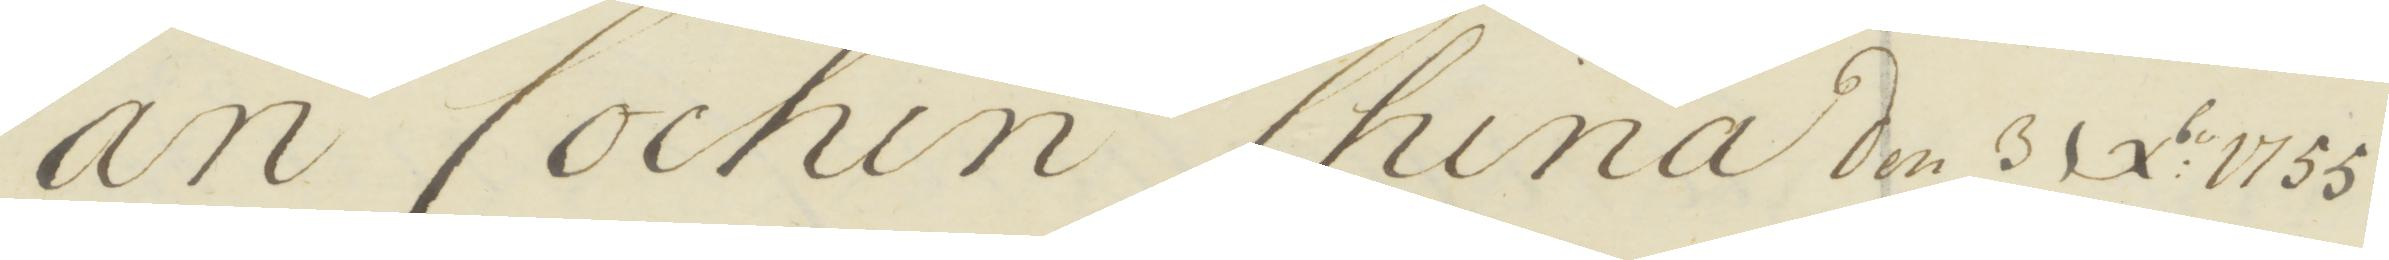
Van Cochin China den 31 X:br 1755
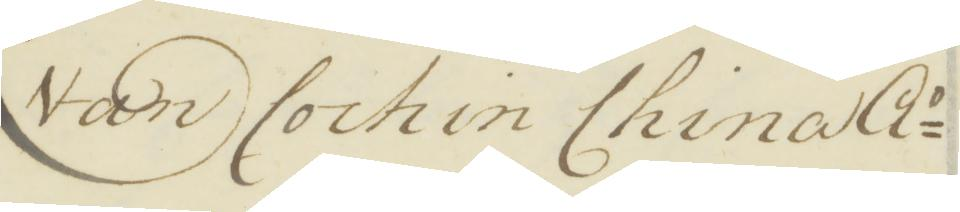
Van Cochin China A=o
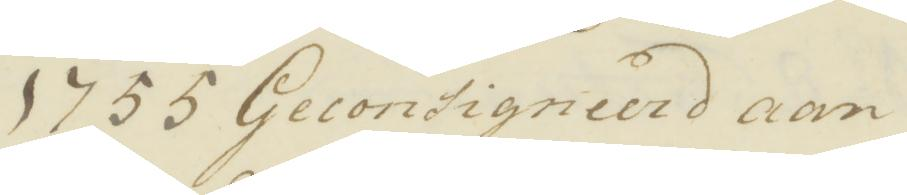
1755 Geconsigneerd aan
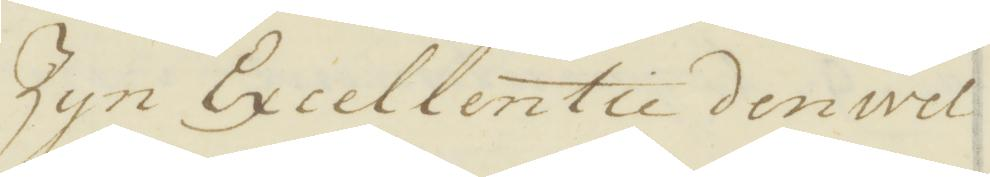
Zyn Excellentie den wel
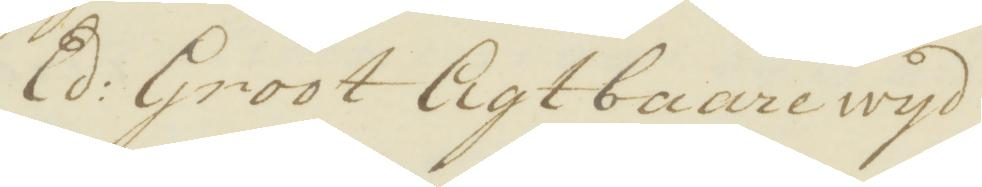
Ed: Groot Agtbaare wyd
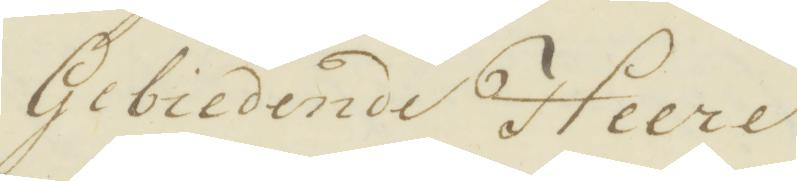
Gebiedende Heere
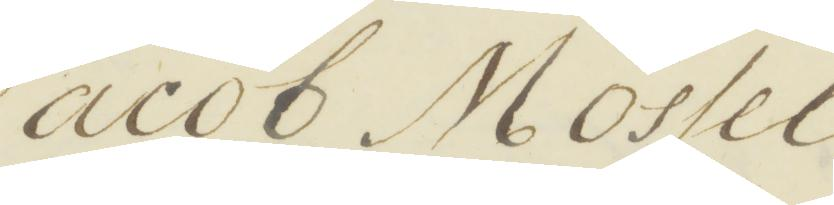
Iacob Mossel
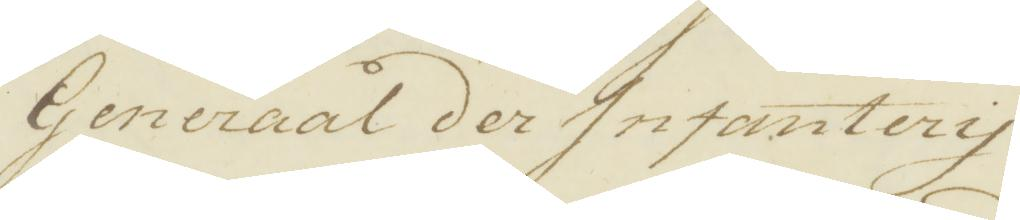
Generaal der Jnfanterij
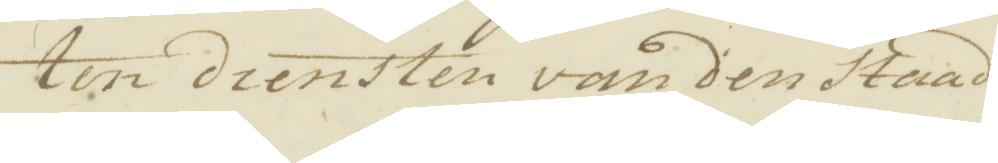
ten diensten van den staad
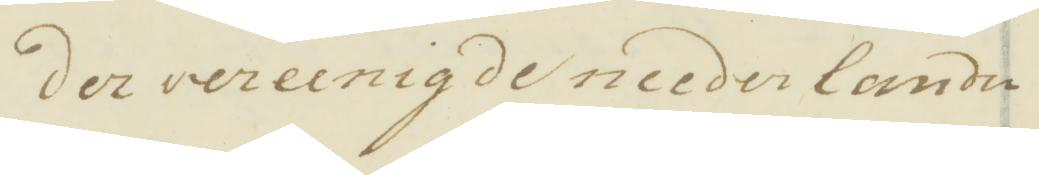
der vereenigde neederlanden
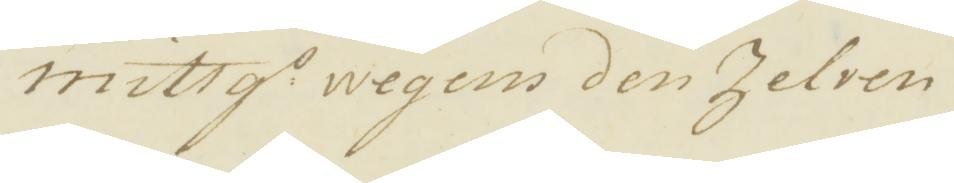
mittg:s wegens den zelven
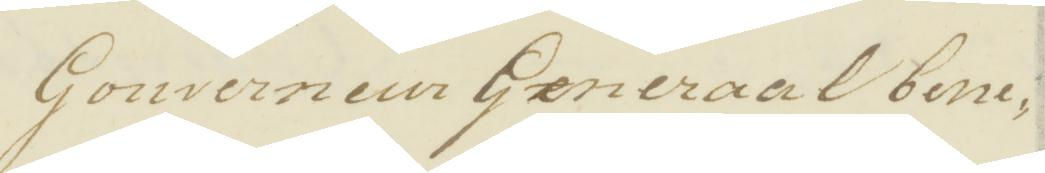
Gouverneur Generaal bene„
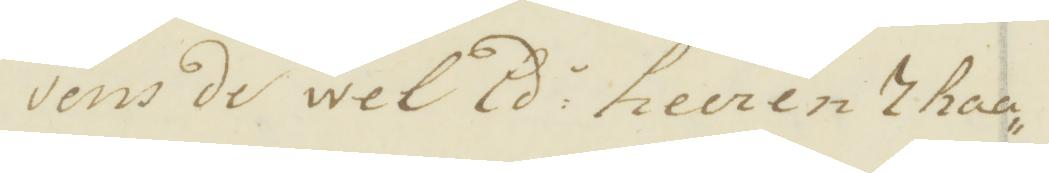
vens de wel Ed:' heeren rhaa„
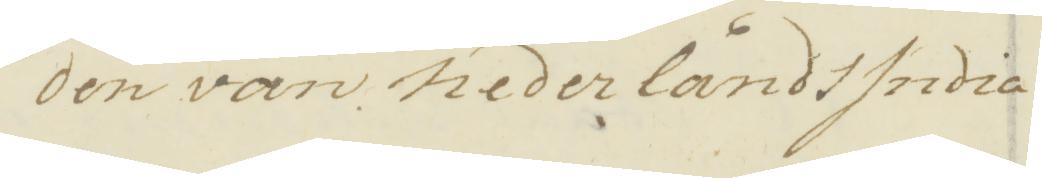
den van nederlands Jndia
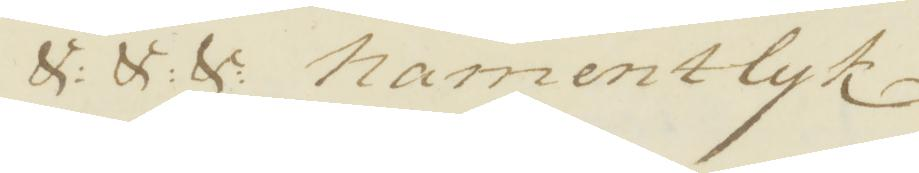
&:c &:c &:c namentlyk
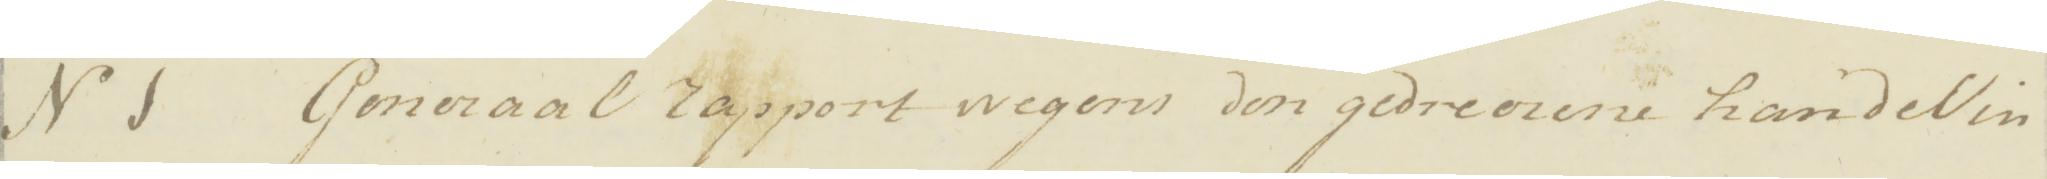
N 1 Generaal rapport wegens den gedreevene handel in
